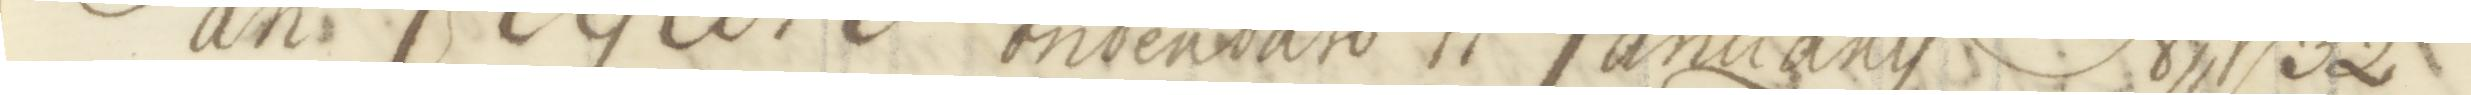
Van Ceijlon ondßerdato 17 Januarij A„o 1732
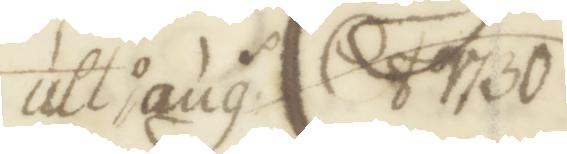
ult„o aug:s Ao 1730
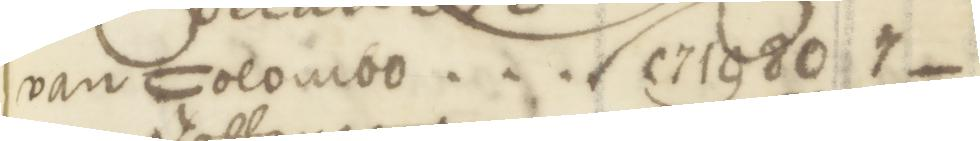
van colombo . . . ƒ 571980 7 —
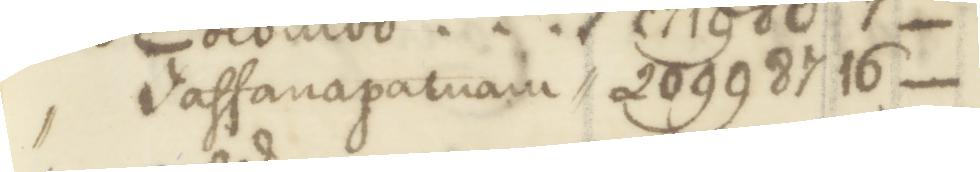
„ Iaffanapatnam „ 209987 16 —
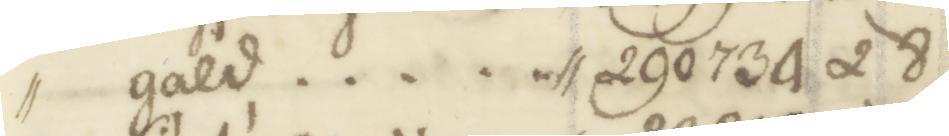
„ gale . . . . ..„ 290734 2 8
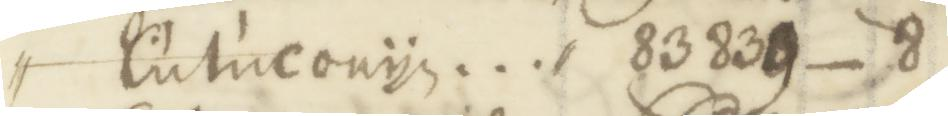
„ tutucorijn . . . „ 83839 — 8
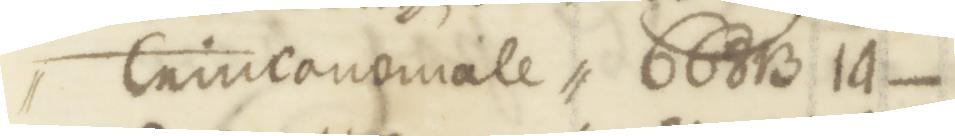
„ trinconomale „ 66813 14 —
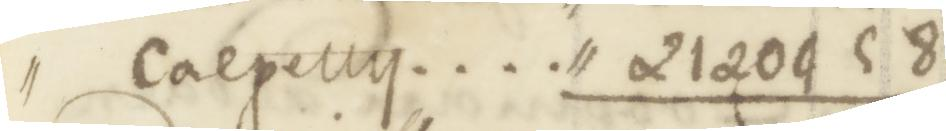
„ calpettij . . . . „ 21204 5 8
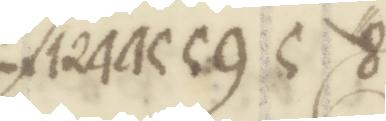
ƒ244559 5 8
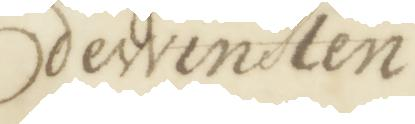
dewinsten
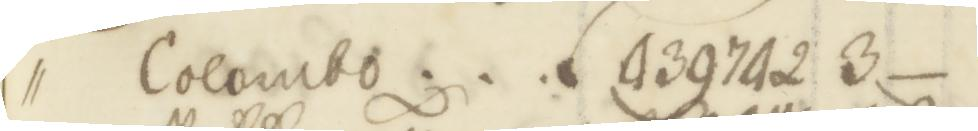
„ Colombo . . . ƒ 439742 3 —
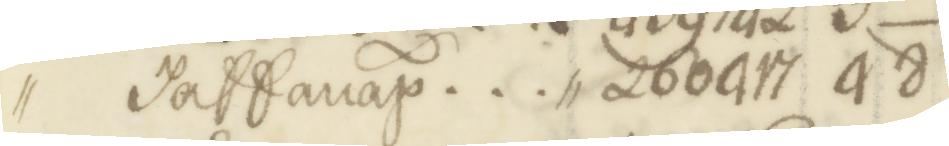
„ Iaffanap . . . „ 260417 4 8
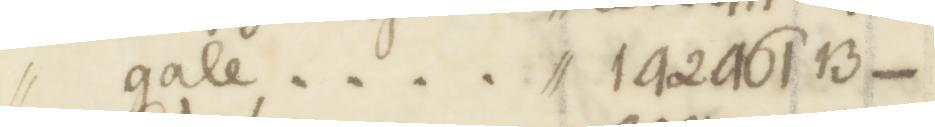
„ gale . . . . „ 142461 13 —
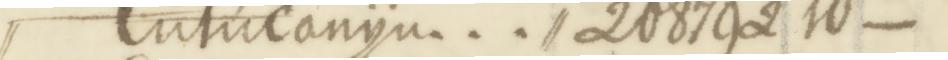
„ tutucanijn . . . „ 208792 10 —
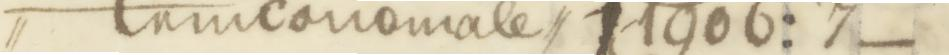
„ trinconomale „ 11906: 7 —
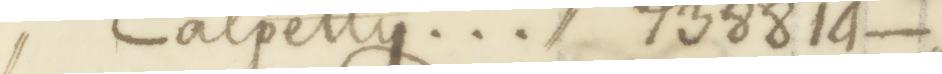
„ calpettij . . . „ 7388 14 —
